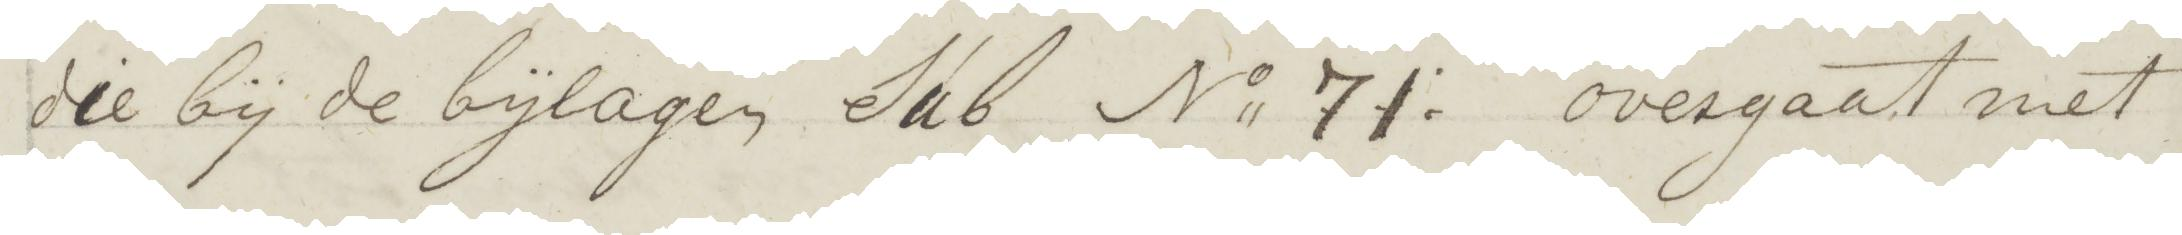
die bij de bijlagen sub N„o 71: overgaat met
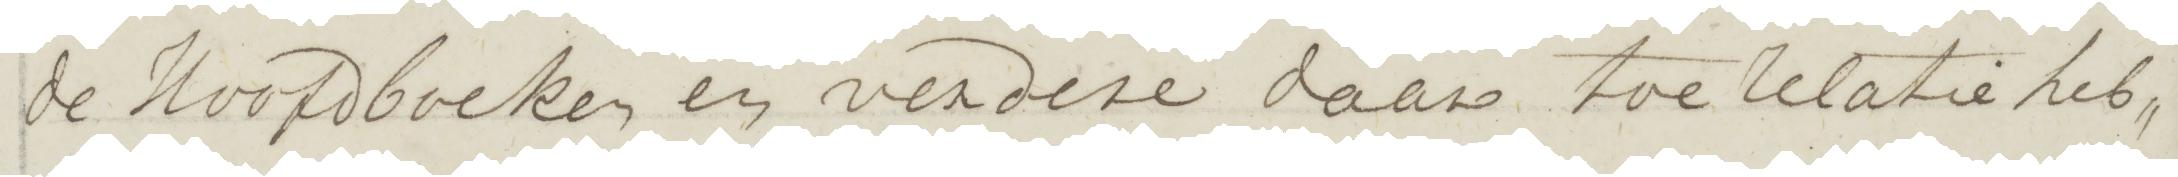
de Hoofdboeken en verdere daar toe relatie heb„
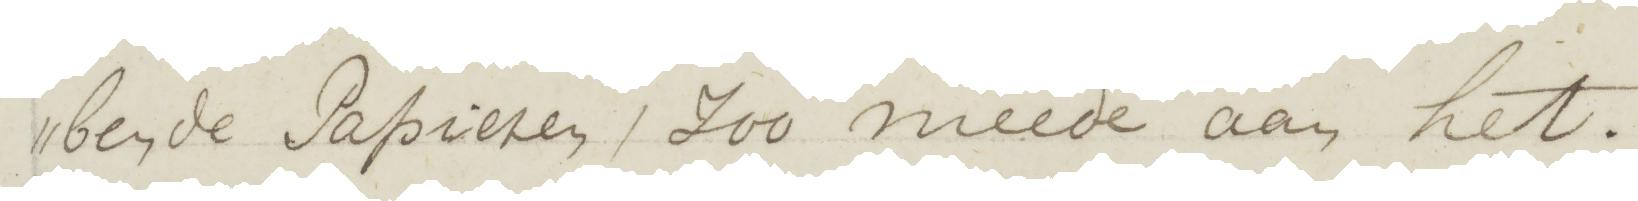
„bende Papieren / zoo meede aan het.
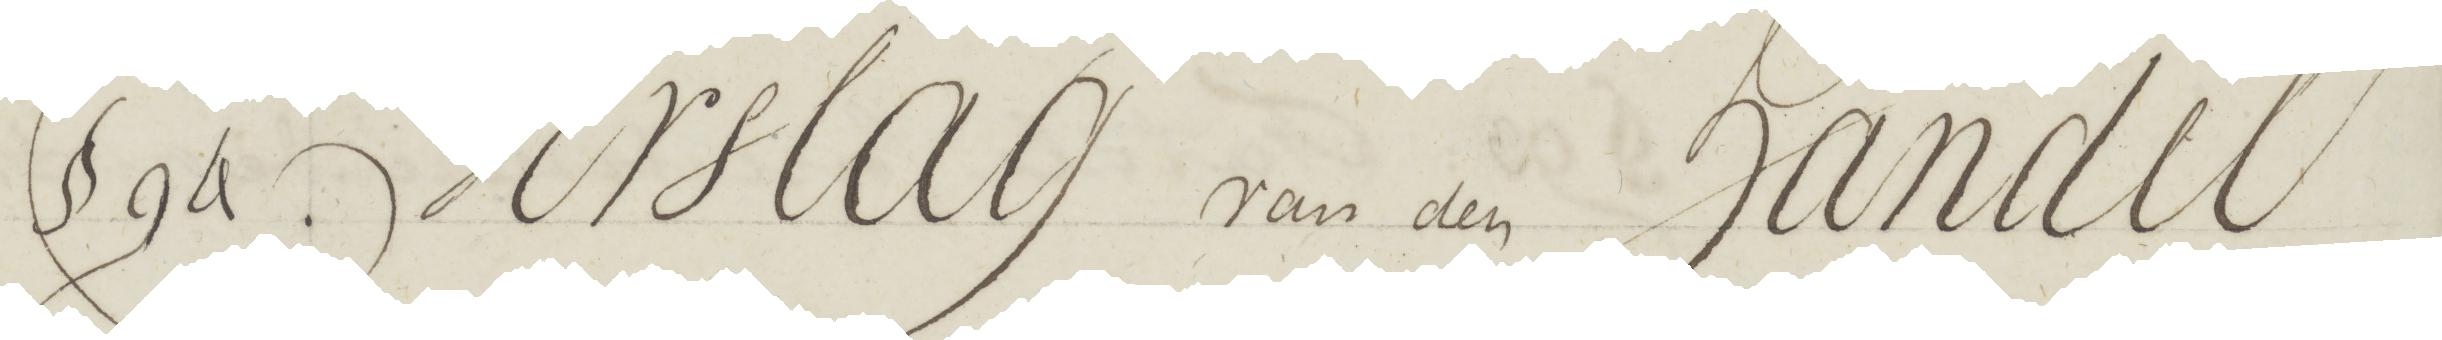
§ 94. Verslag van den Handel
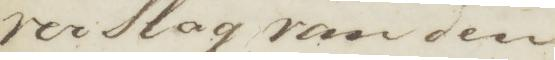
verslag van den
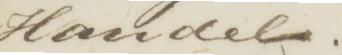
Handel.
